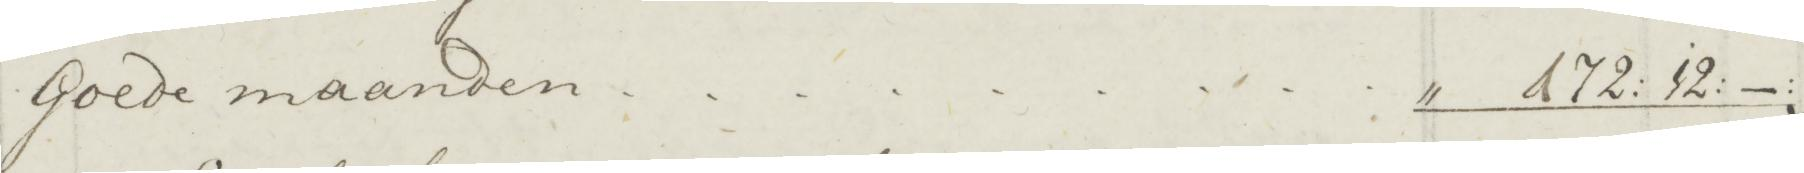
Goede maanden . . . . . . . . . „ 472: 12: —:
